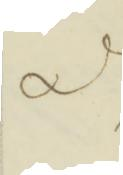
do„
